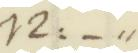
12: – „
